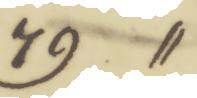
79 „
